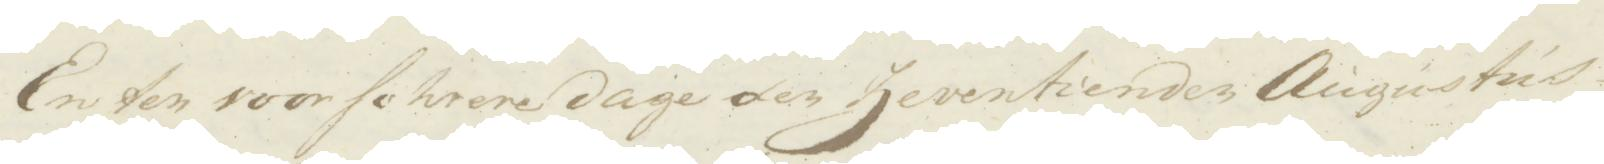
En ten voorschreve dage den zeventienden Augustus
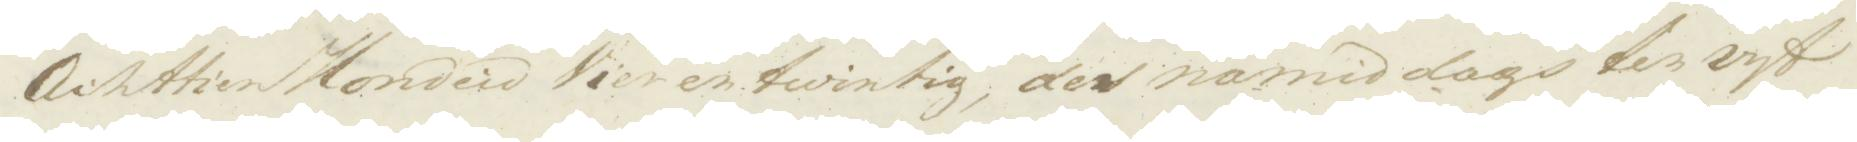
Achttien Honderd Vier en twintig, des namiddags ten vyf
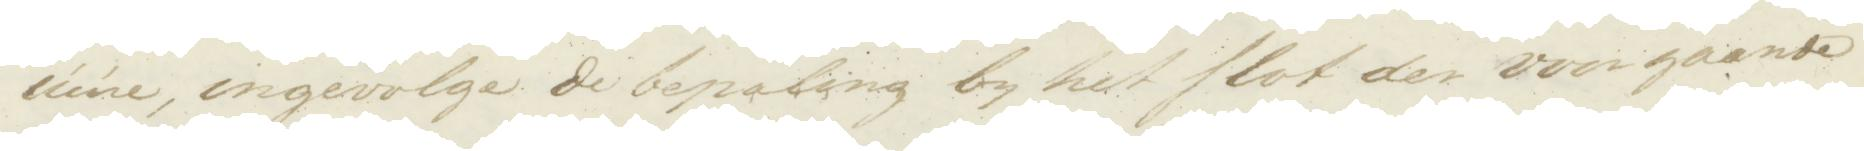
uure, ingevolge de bepaling by het slot der voorgaande
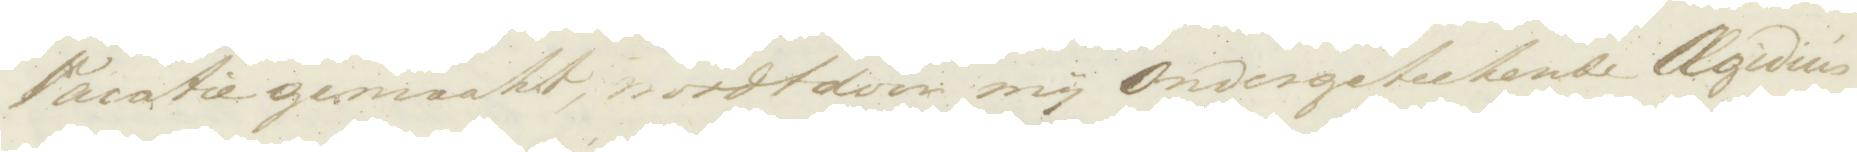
Vacatie gemaakt, wordt door mij ondergeteekende AEgidius
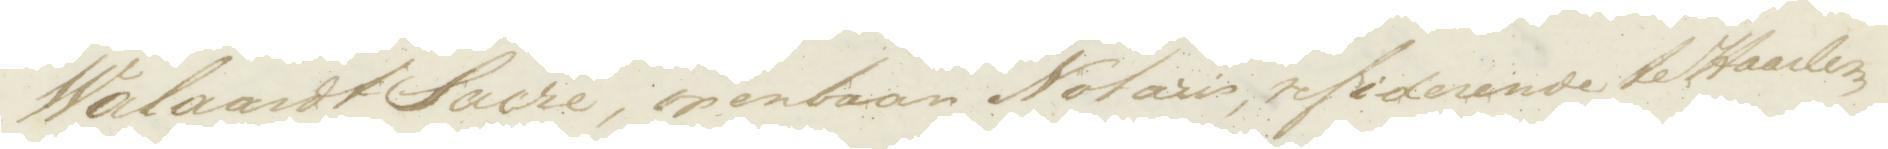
Walaardt Sacré, openbaar Notaris, residerende te Haarlem
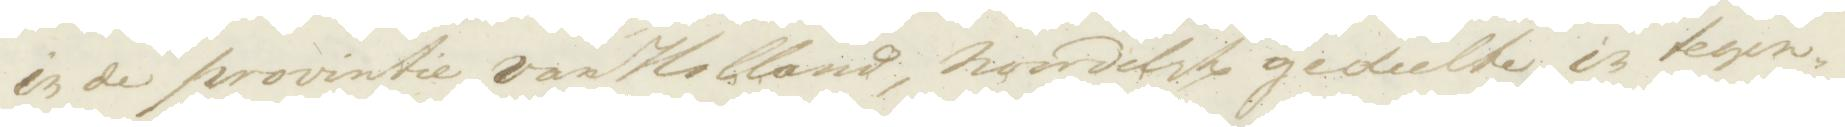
in de provintie van Holland, Noordelyk gedeelte, in tegen„
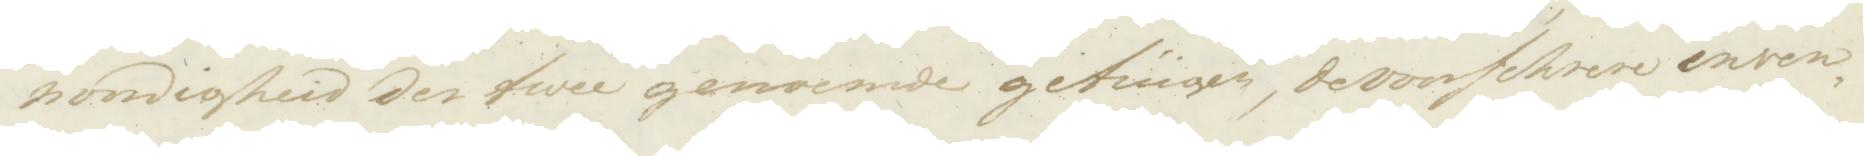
woordigheid der twee genoemde getuigen, de voorschreve inven„
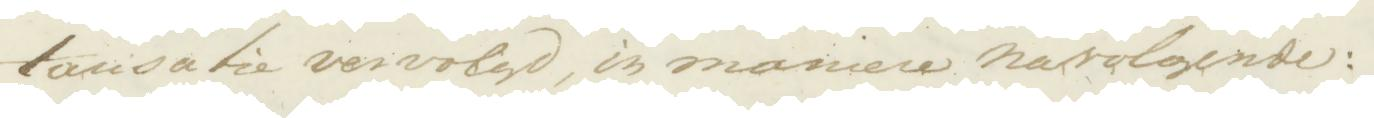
tarisatie vervolgd, in maniere navolgende:
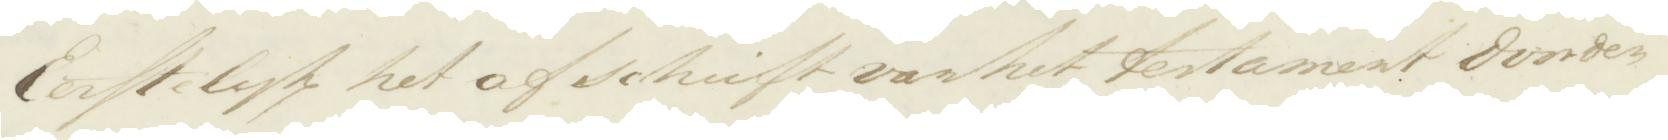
Eerstelyk het afschrift van het testament door den
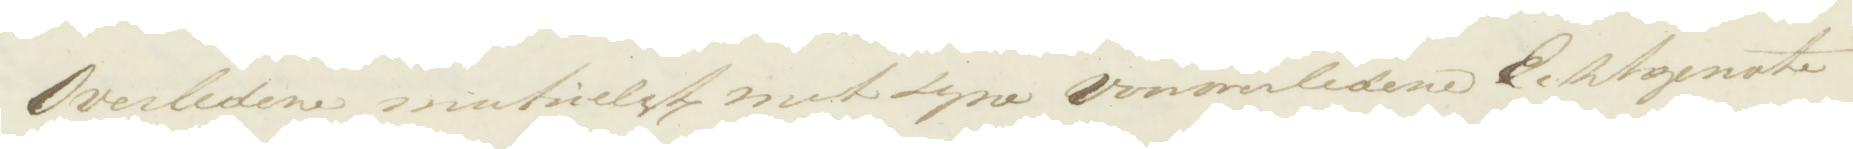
Overledene mutivelyk met zyne vooroverledene Echtgenote
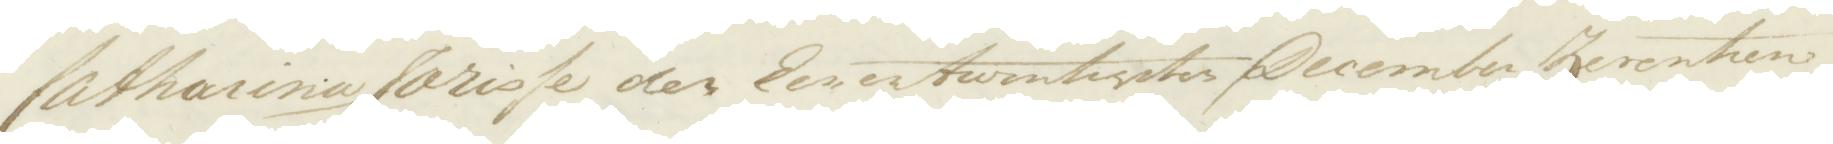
Catharina Jorisse den Een en twintigsten December Zeventien
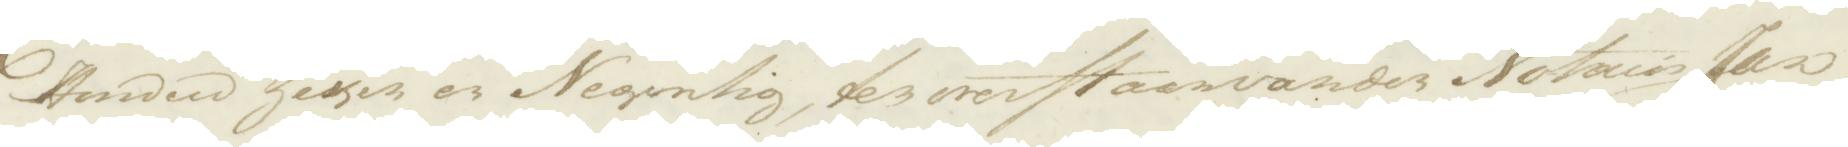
Honderd Zeven en Negentig, ten overstaan van den Notaris Jan
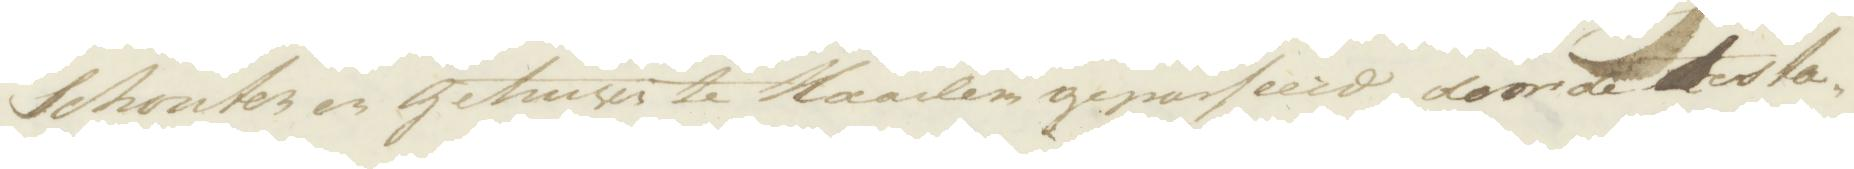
Schouten en getuigen te Haarlem gepasseerd door de testa„
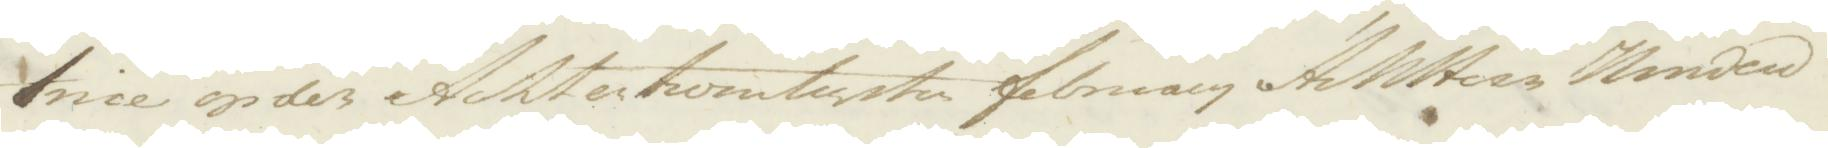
trice op den Achtentwintigsten february Achttien Honderd
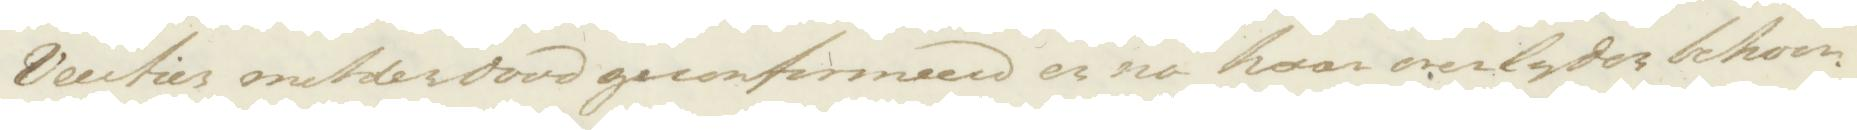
Veertien met der dood geconfirmeerd en na haar overlyden behoor.
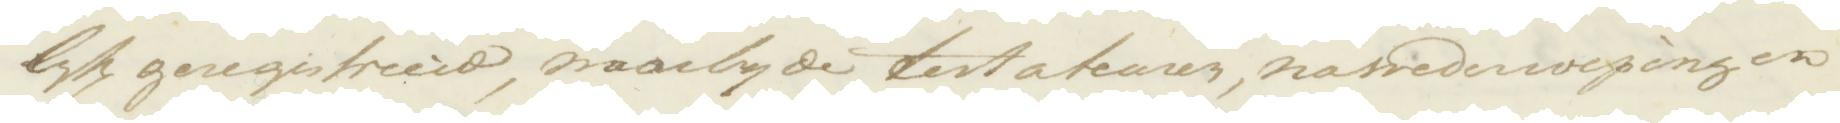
lyk geregistreerd, waarby de testateuren, na wederroeping en
